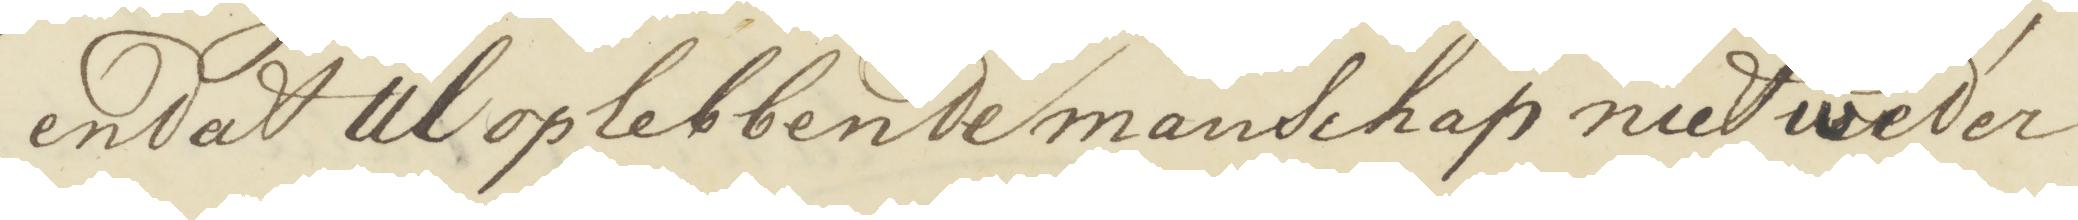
en dat ul op hebbende manschap niet weder
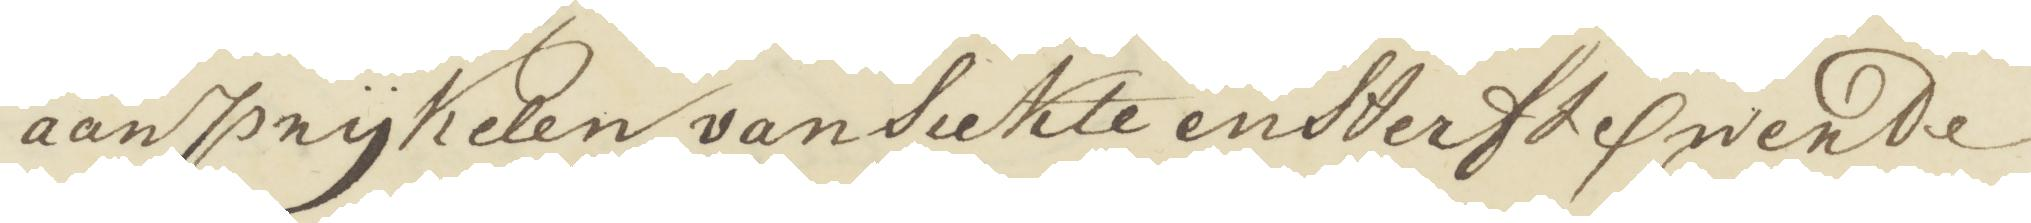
aan prijkelen van siekte ensterfte werde
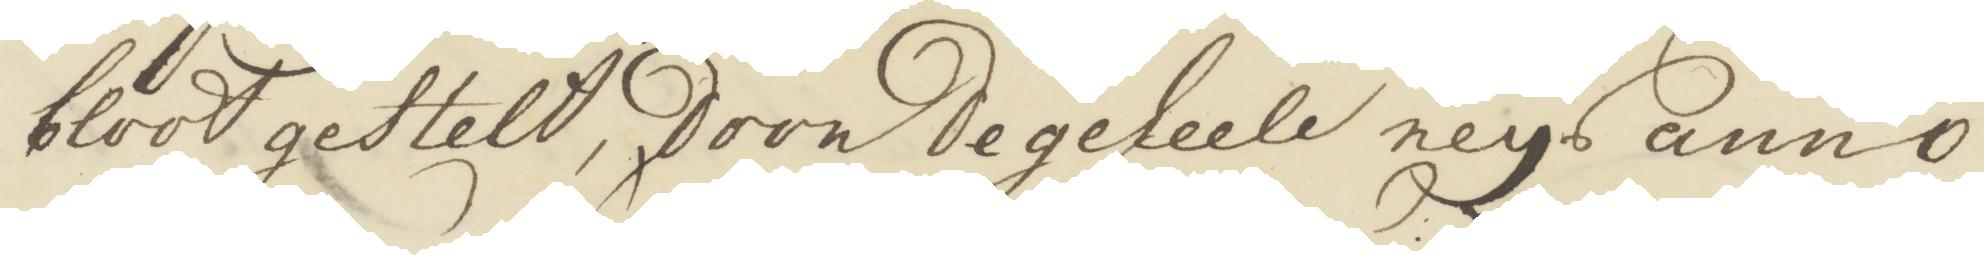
bloot gestelt, ,door de geheele reijs anno
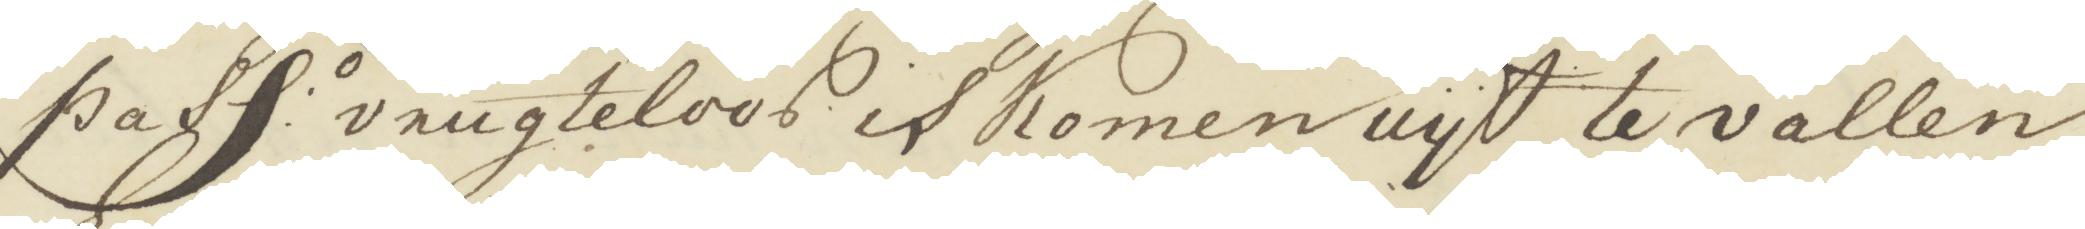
pass:o vrugteloos is komen uijt te vallen
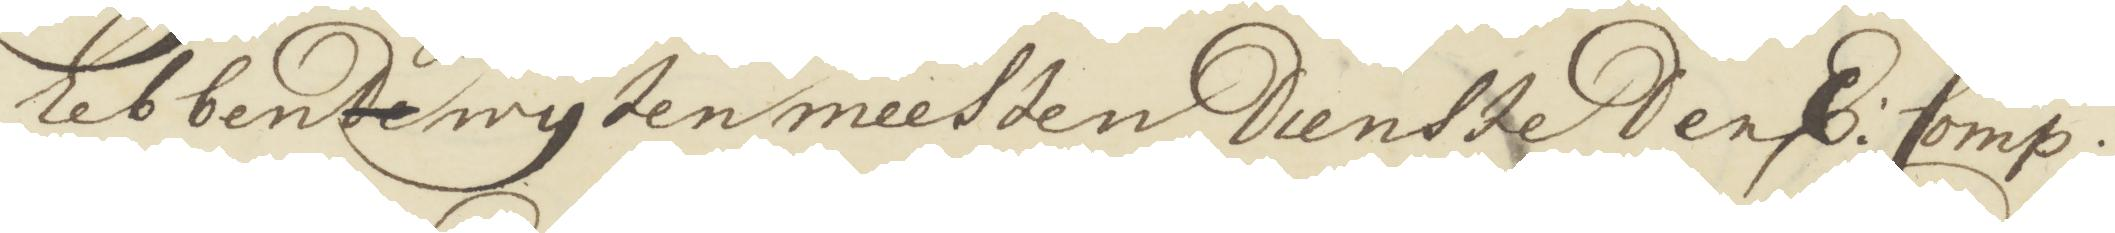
hebbende wij ten meesten dienste der E: Comp
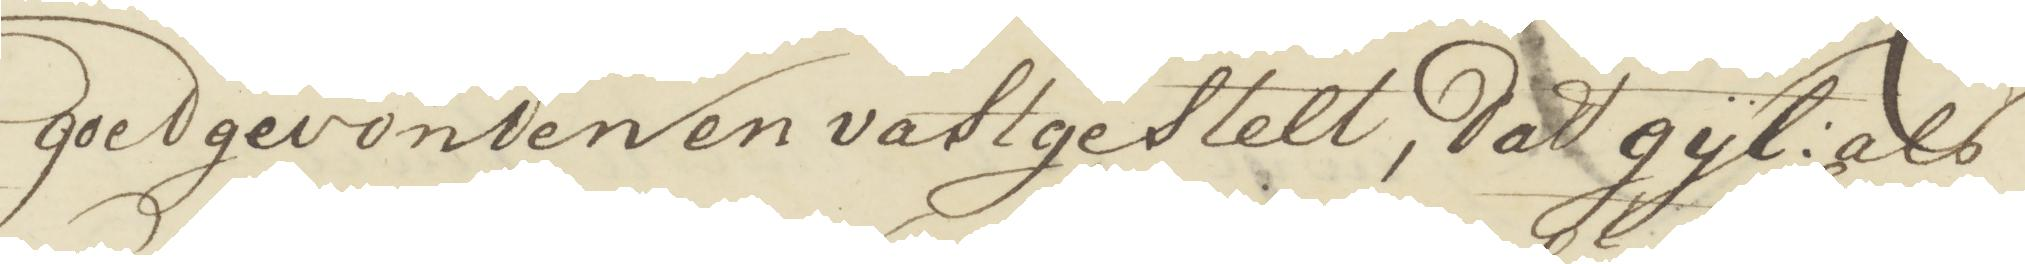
goedgevonden en vastgestelt, dat gijl: als
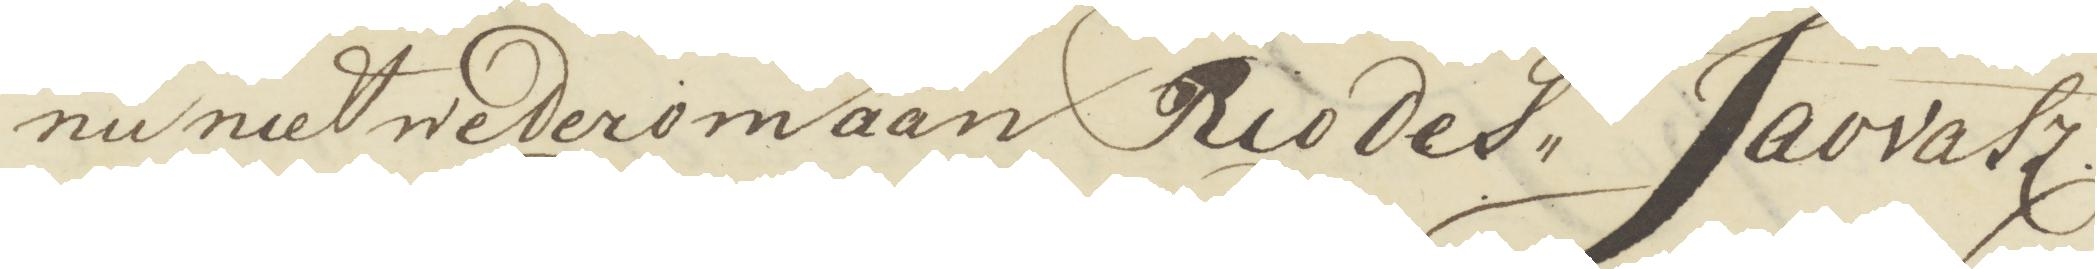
nu niet wederom aan Rio des„ Jaovasz
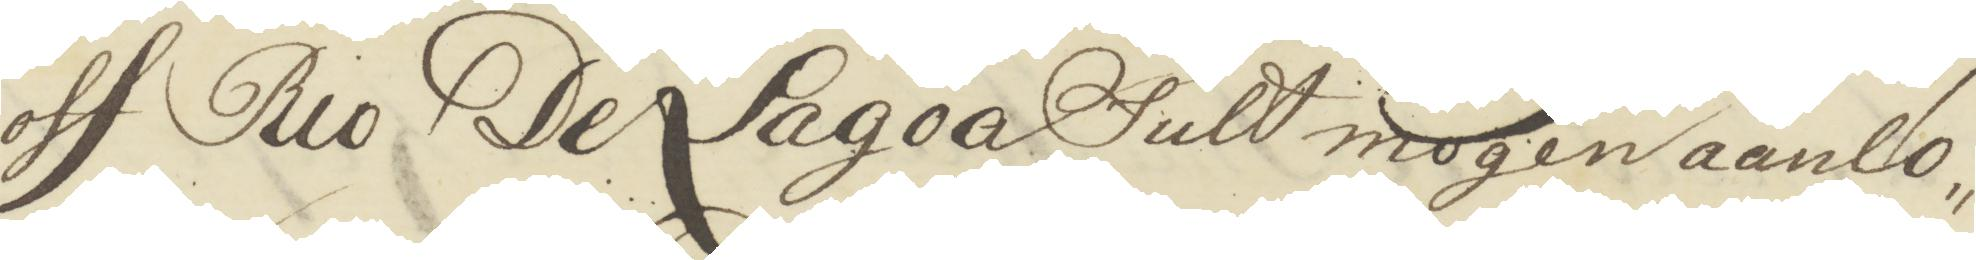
off Rio De Lagoa sult mogen aanlo„
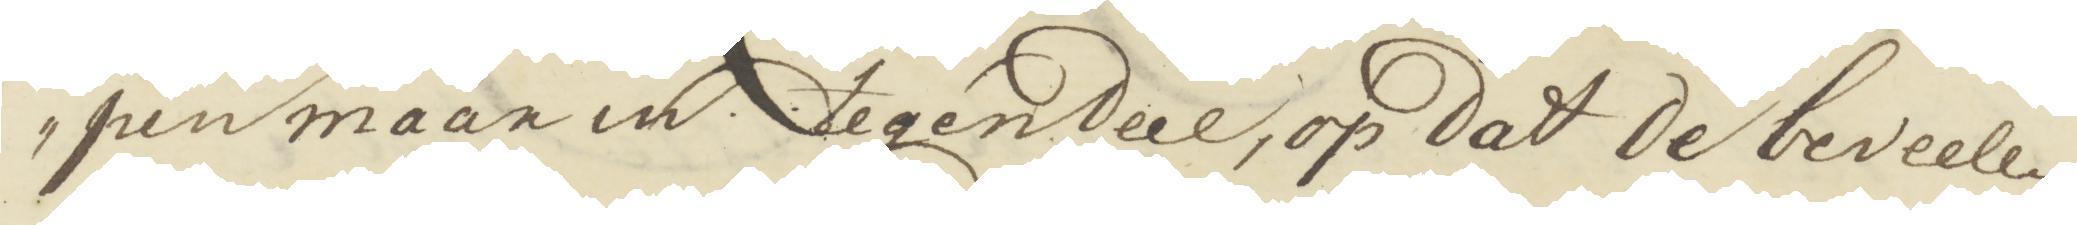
„pen maar in tegendeel, op dat de beveelen
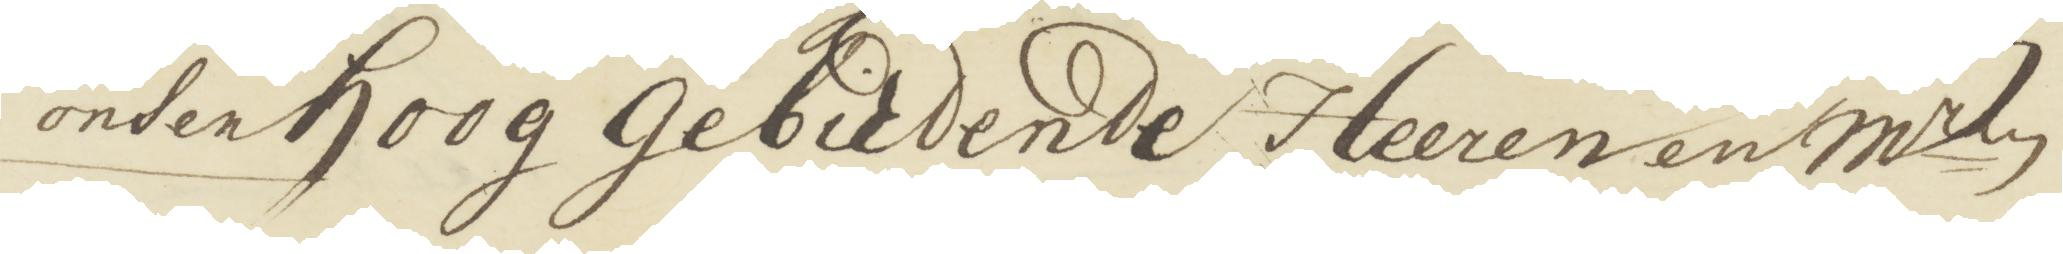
onser Hoog gebiedende Heeren en m=ren
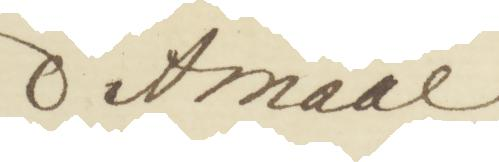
ditmaal
